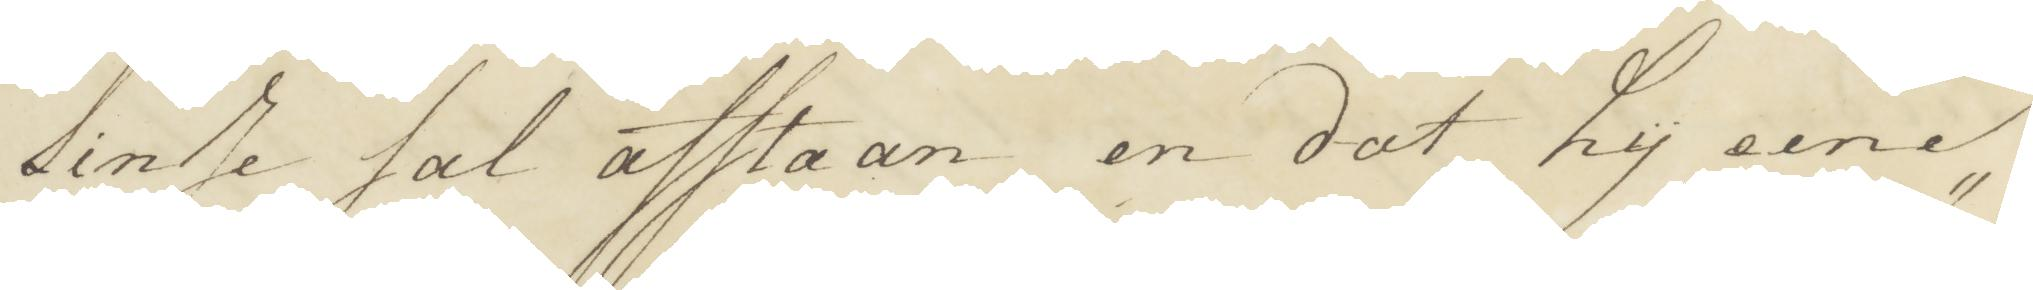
sinje sal afstaan, en dat hij eene„
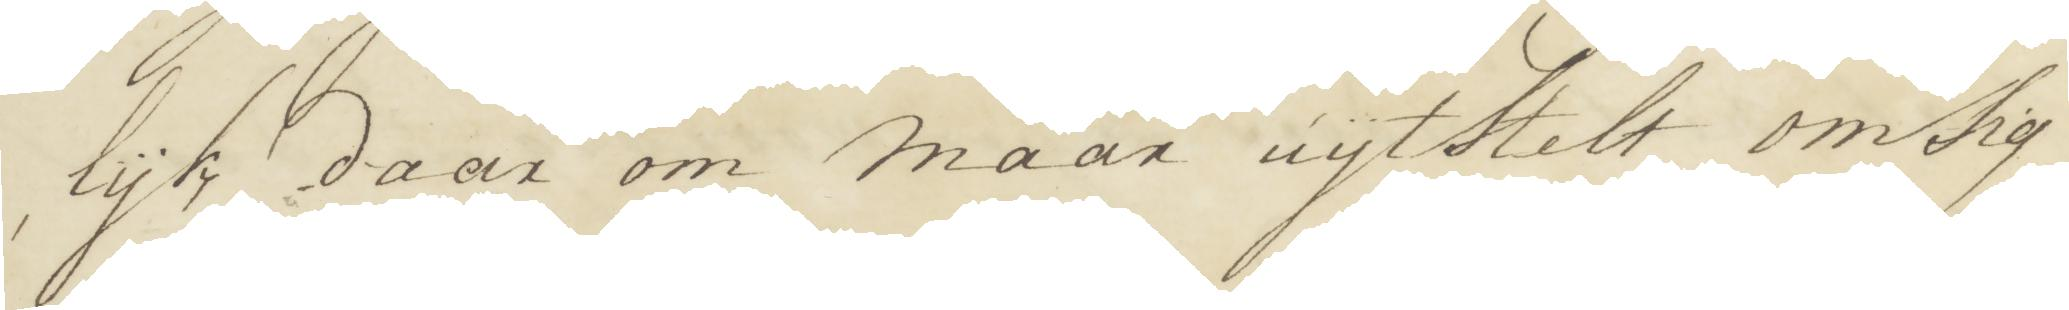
„lijk daar om maar uijtstelt om sig
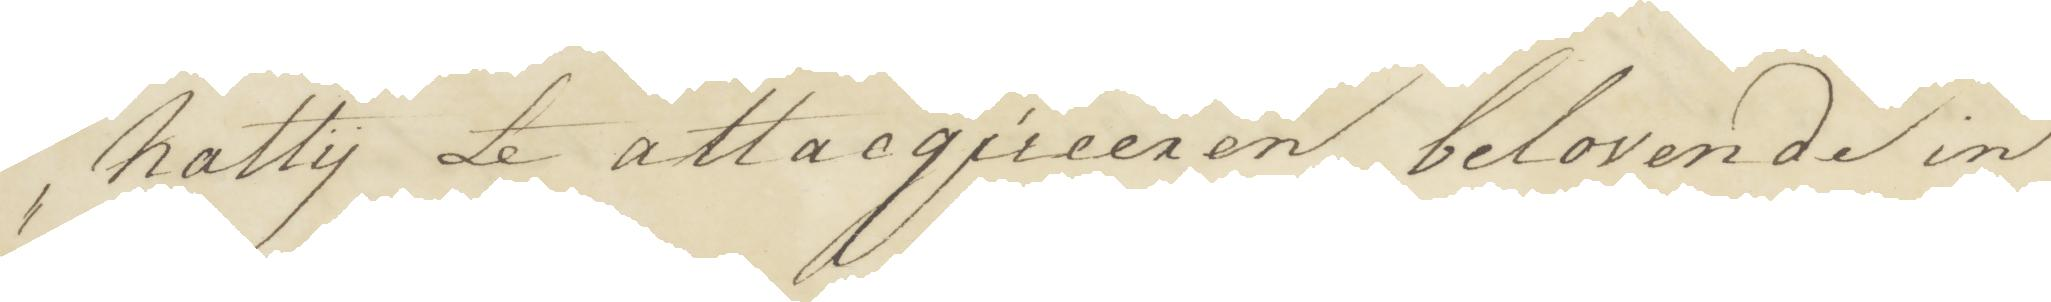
„nattij te attacqueeren, belovende in
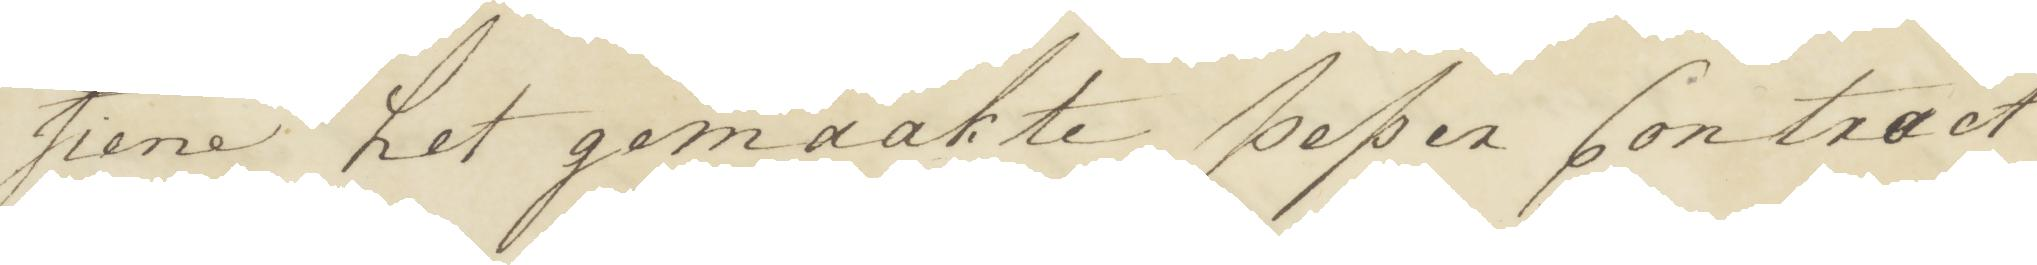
siene het gemaakte peper Contract
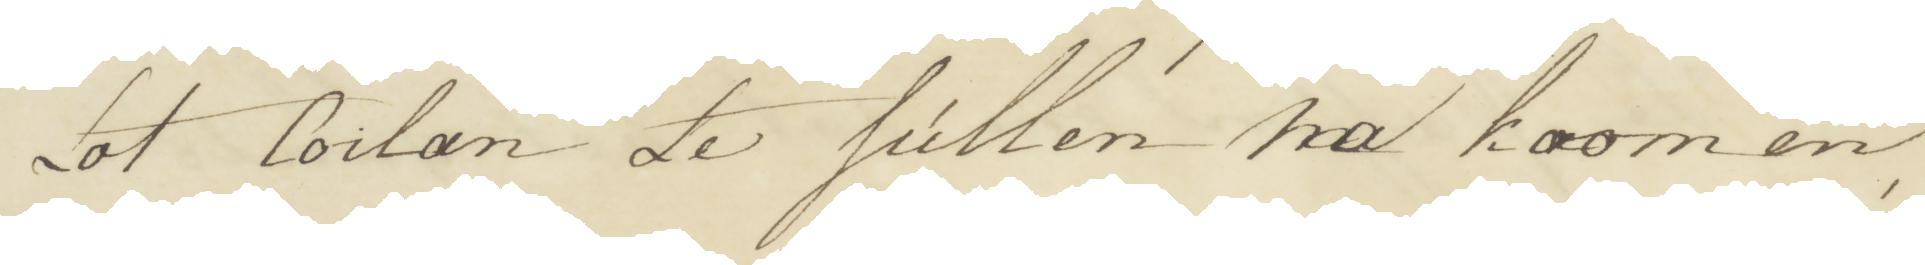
tot Coilan te sullen na koomen,
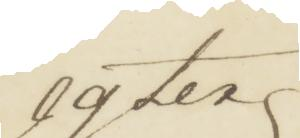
egter,
